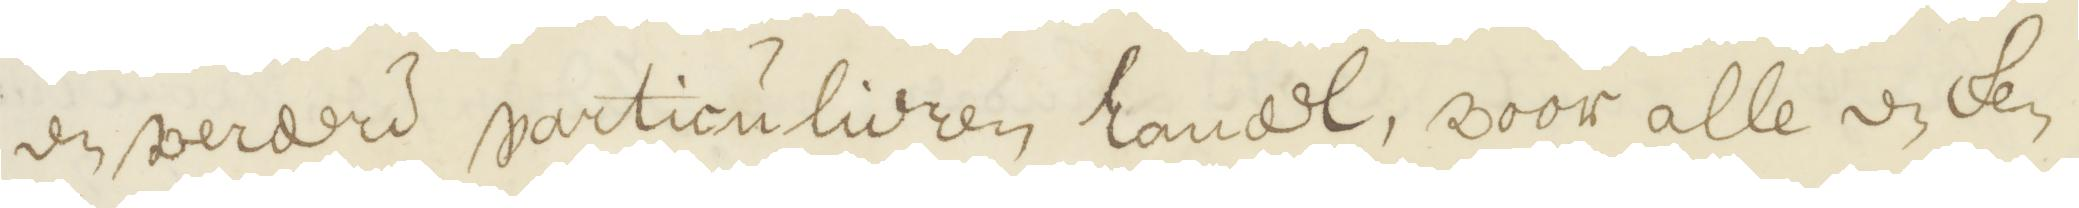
en verdere particulieren handel, voor alle en Een
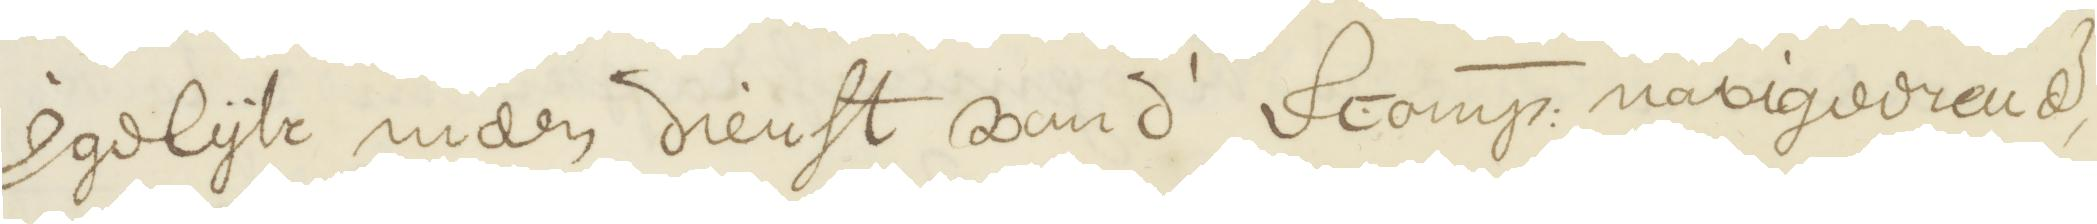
jgelijk in den dienst van d’Ecomp: navigeerende,
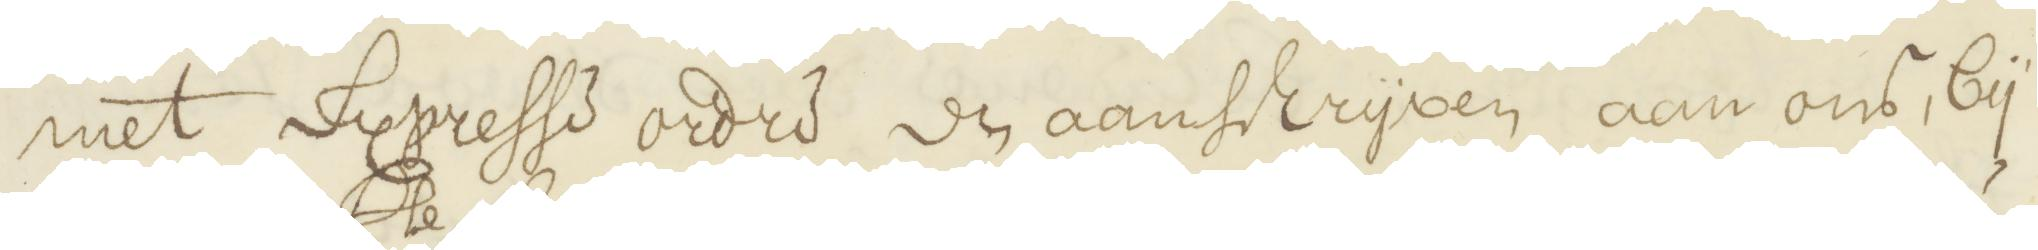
met Expresse ordre en aanschrijven aan ons, bij
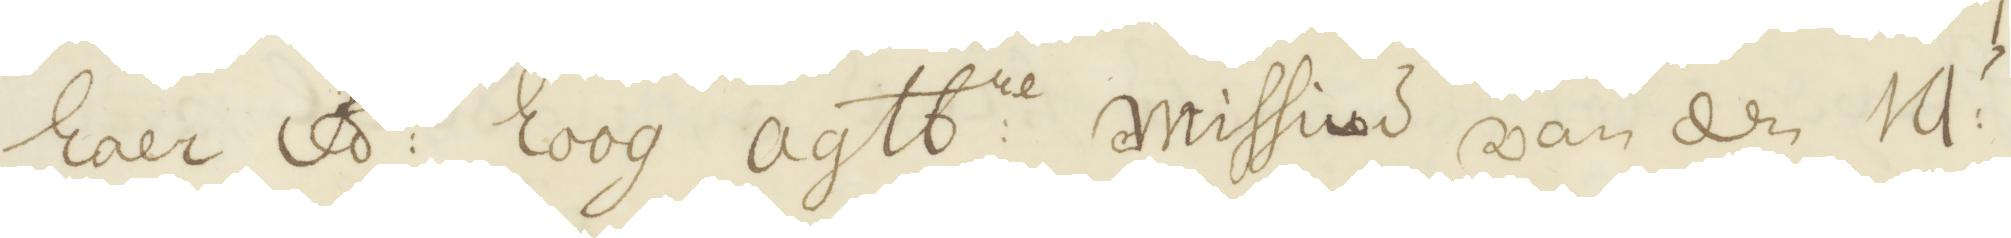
haer Ed:le hoog agtb:re missive van den 14:'
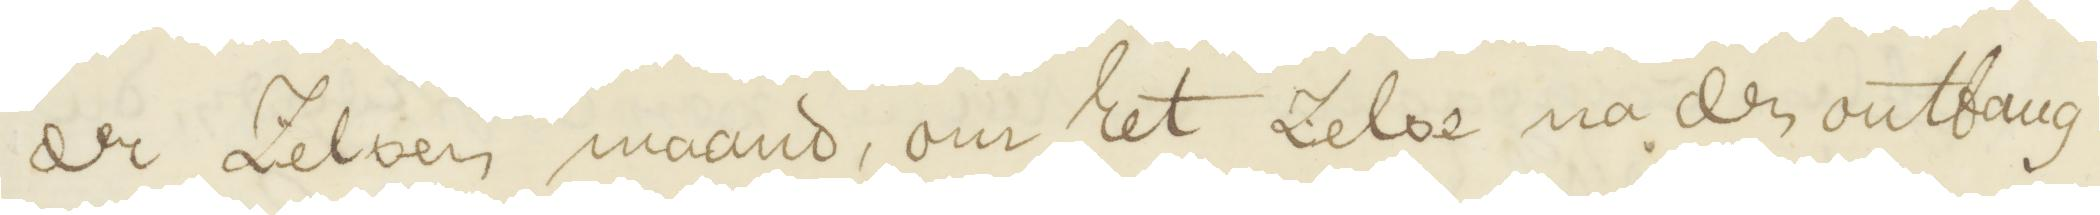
der zelven maand, om het zelve na den ontfang
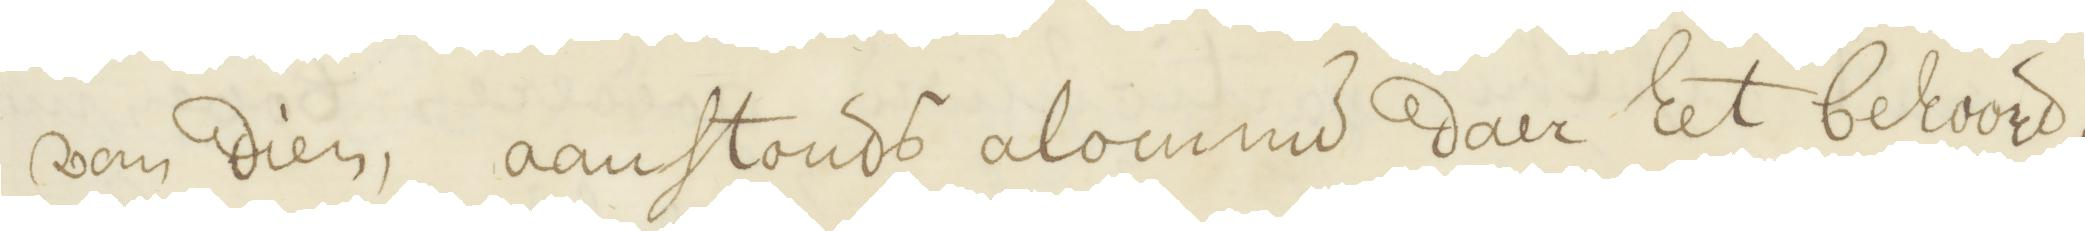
van dien, aanstonds alomme daer het behoord,
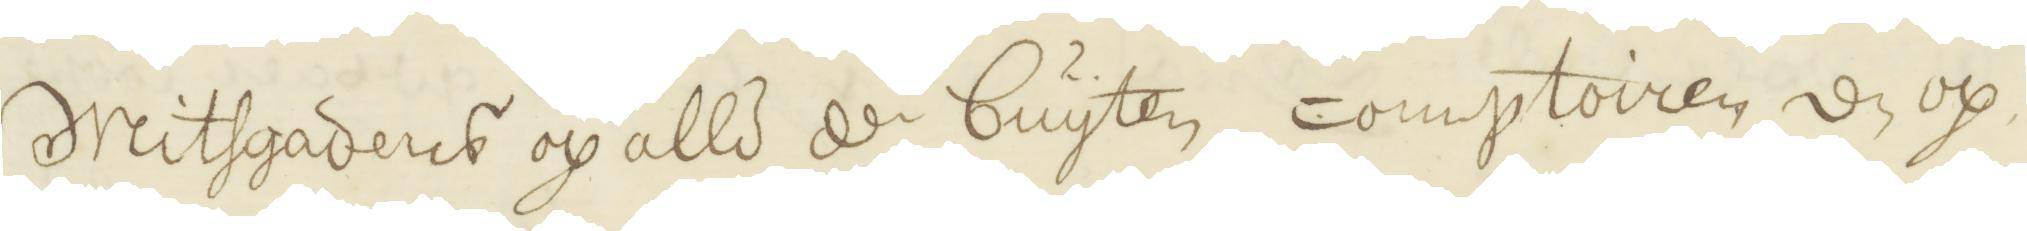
Mitsgaders op alle de buijten comptoiren en op
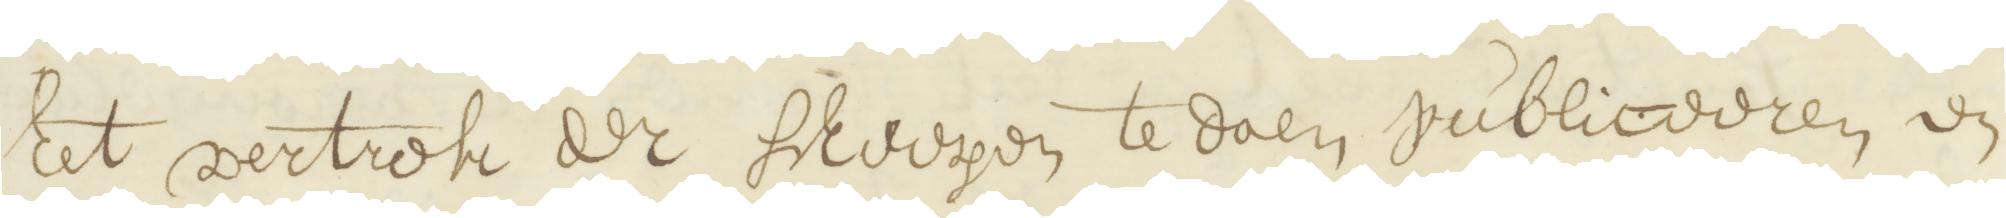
het vertrek der scheepen te doen publiceeren en
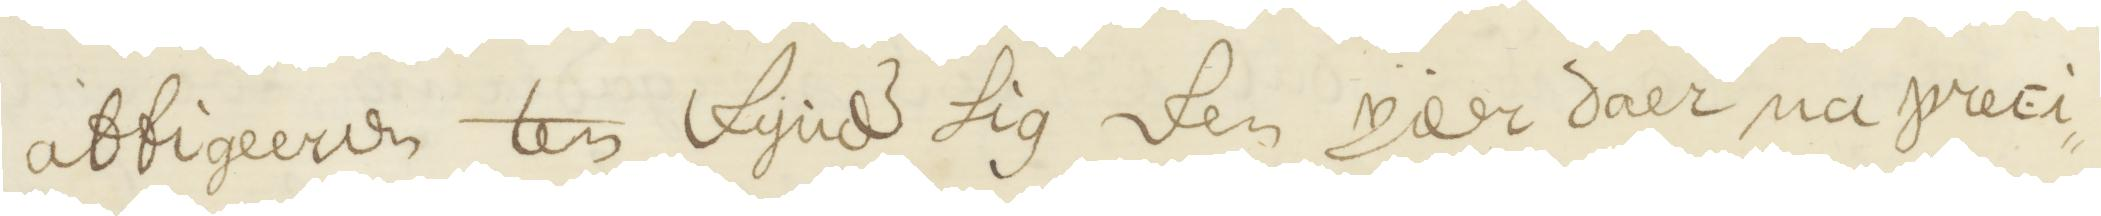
assigeeren ten Eijnde sig Een ijder daer na preci„
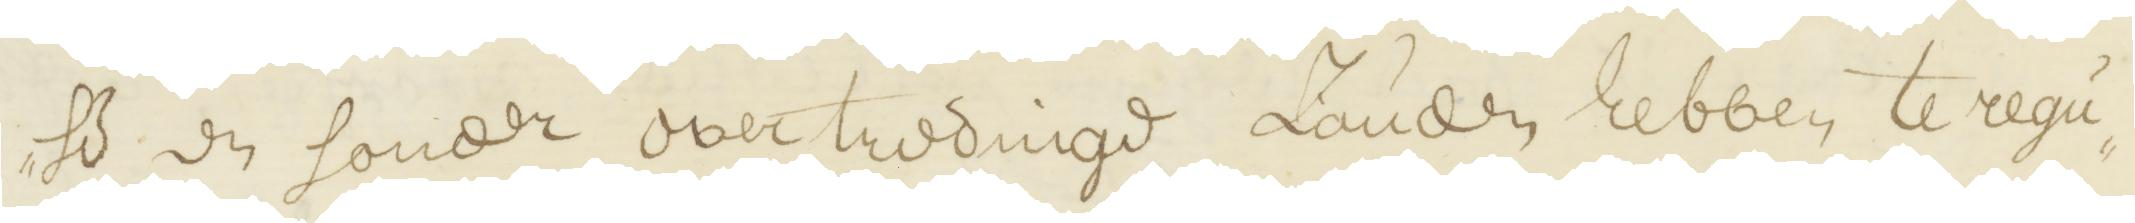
„se en sonder overtredinge zouden hebben te regu„
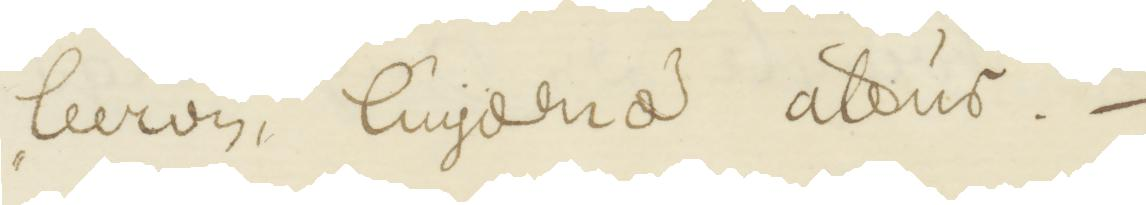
„leeren, luijdende aldus.
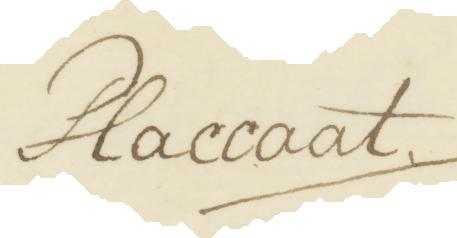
Placcaat.
